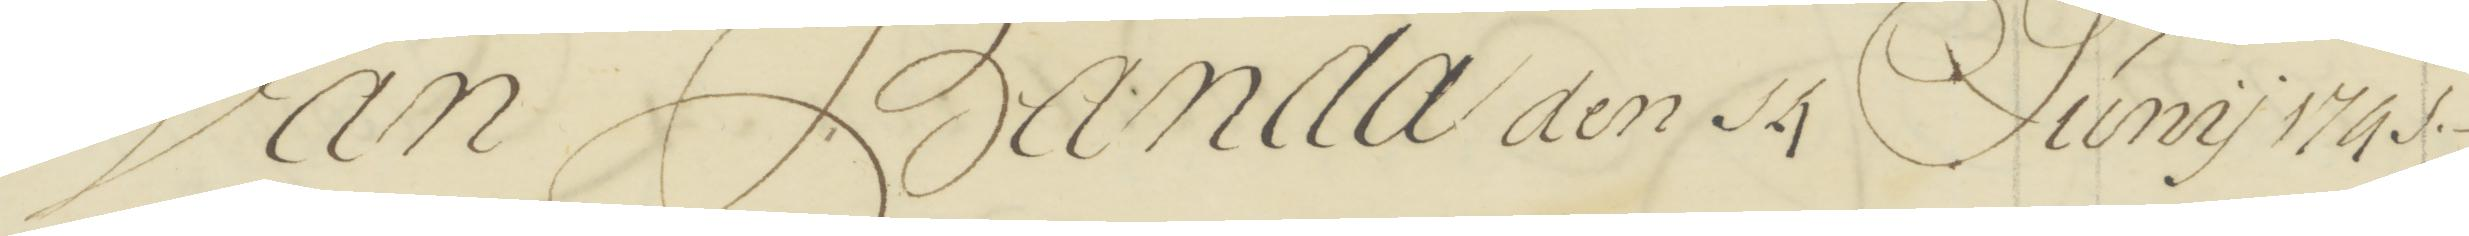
Van Banda den 14 Junij 1741.
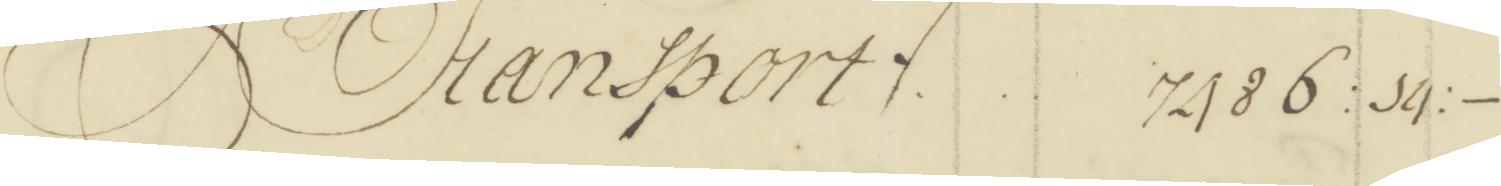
P„r Transport ƒ .. 7486 : 14:—
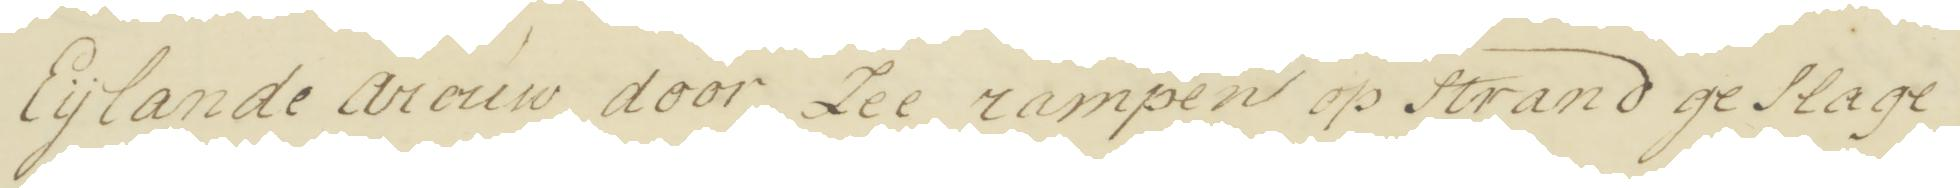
Eijlande Arouw door zee rampen op strand geslage
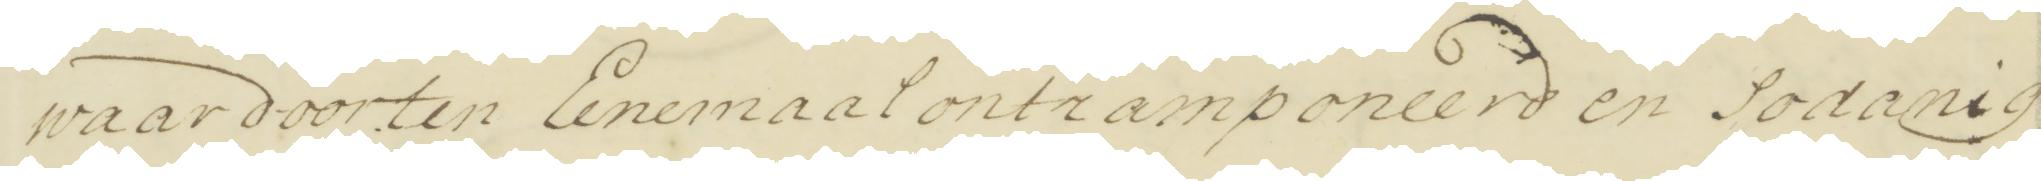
waar door ten Eenemaal ontramponeerd en sodanig
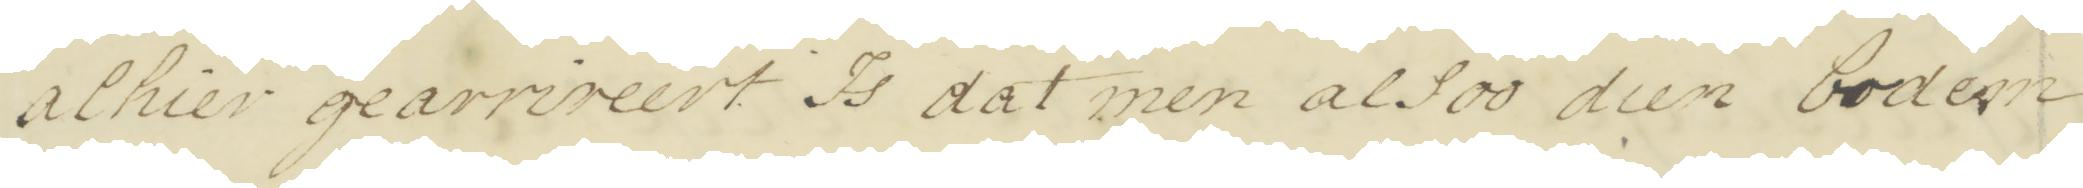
alhier gearriveert Is dat men alsoo dien bodem
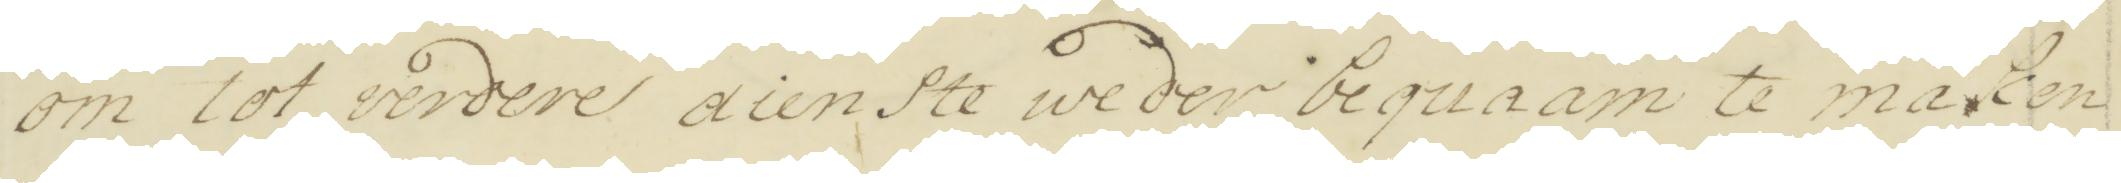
om tot verdere dienste weder bequaam te maken
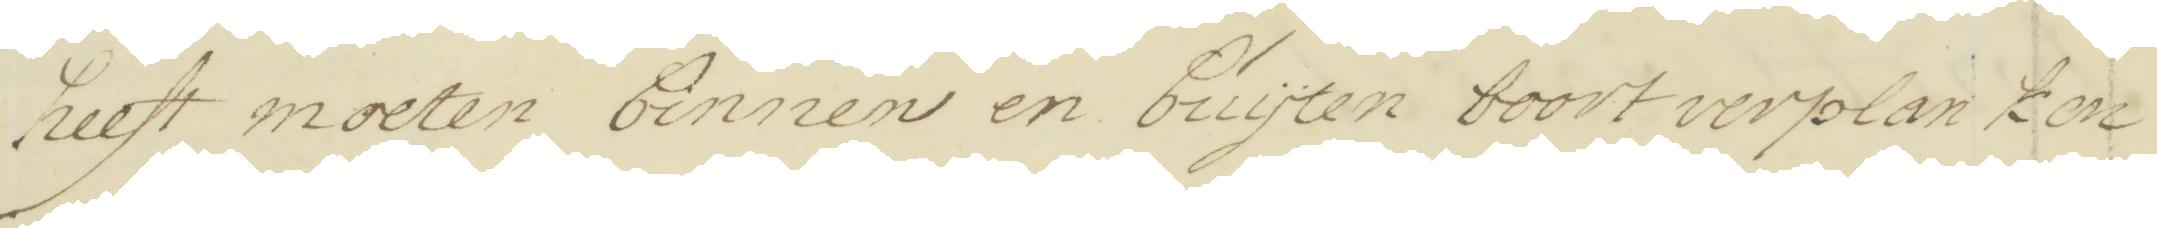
heeft moeten binnen en buijten boort verplan ken
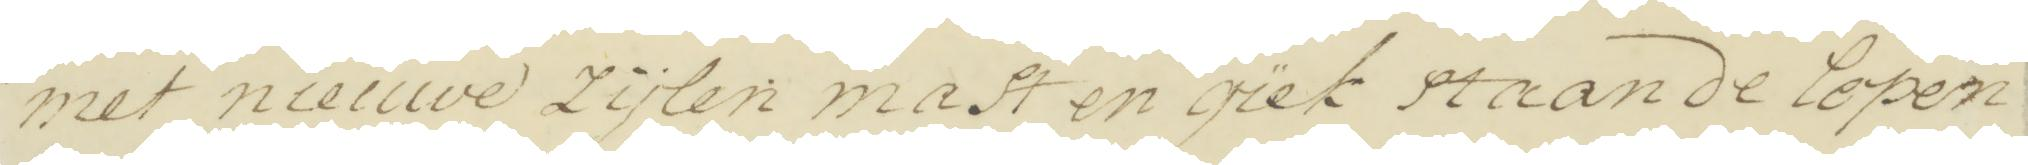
met nieuwe zijlen mast en giek staande lopen
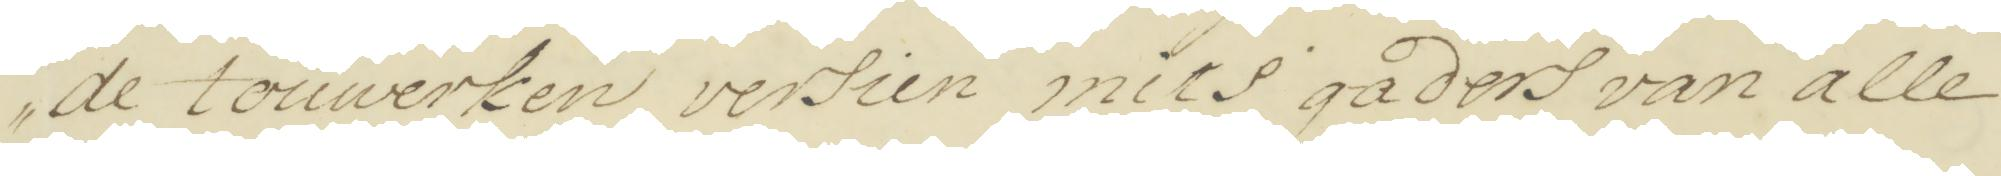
„de touwerken versien mitsgaders van alle
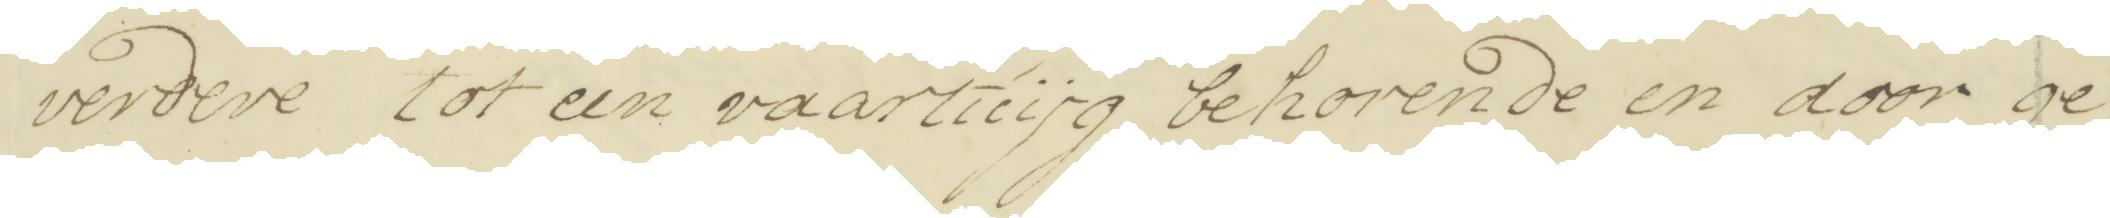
verdere tot een vaartuijg behorende en door ge
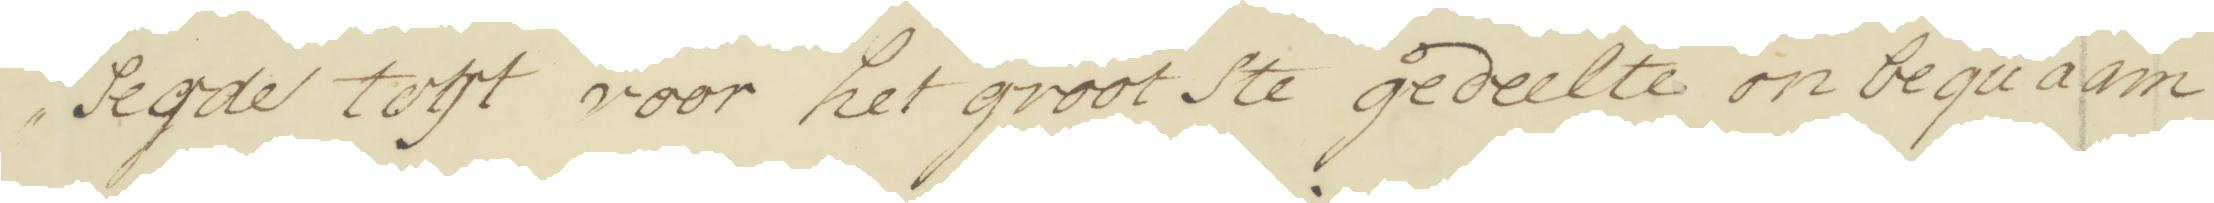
„segde togt voor het groot ste gedeelte on bequaam
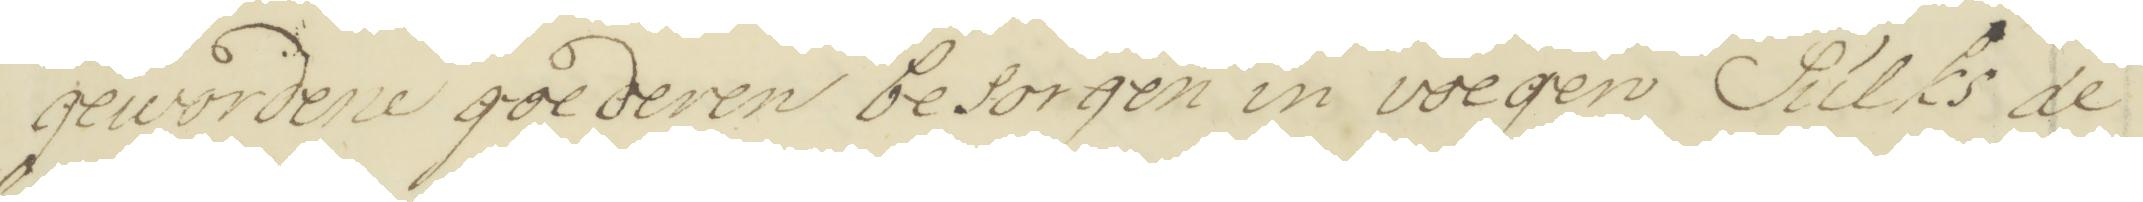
gewordene goederen besorgen in voegen sulks de
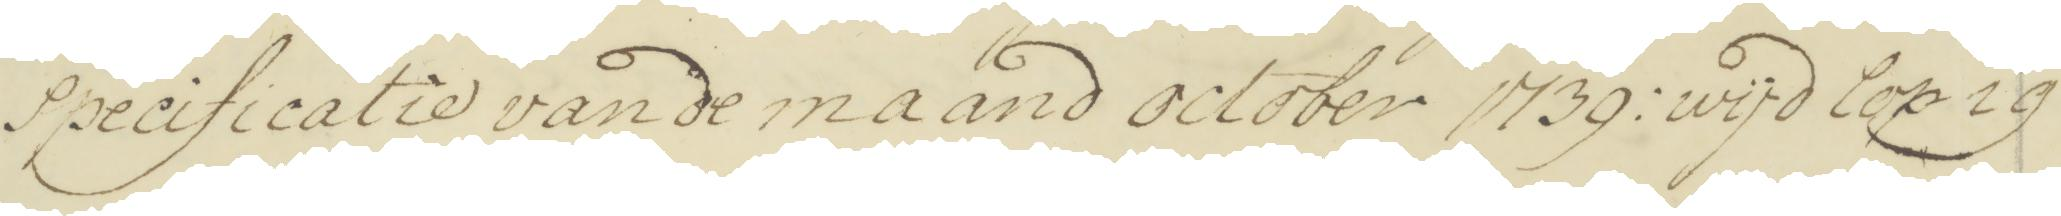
specificatie van de maand october 1739: wijd lop ig
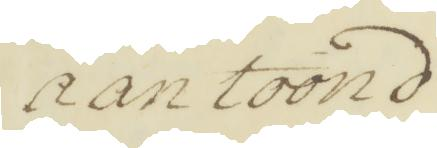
aantoond
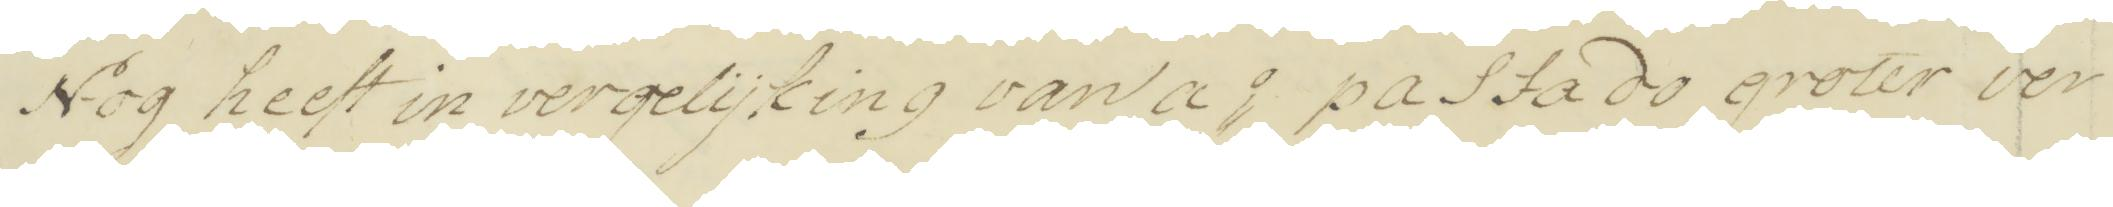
Nog heeft in vergelijking van a„o passado groter ver
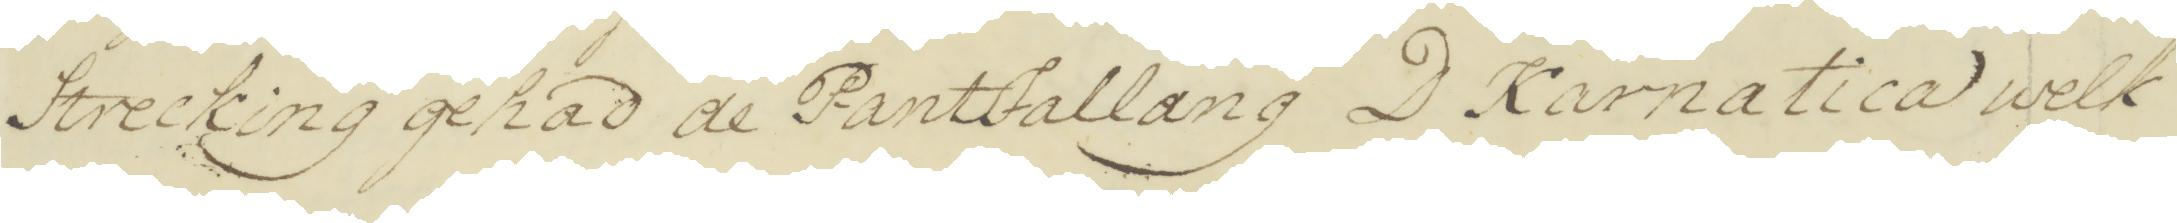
strecking gehad de Pantiallang D Karnatica welk
